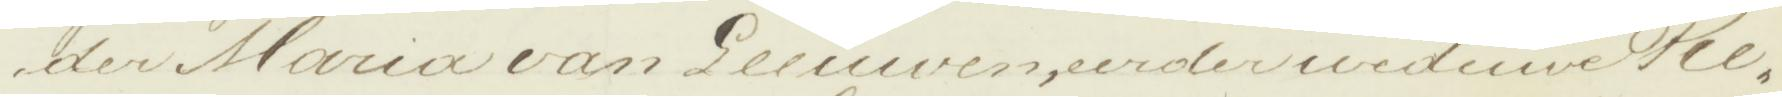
,der Maria van Leeuwen, eerder weduwe Pie„
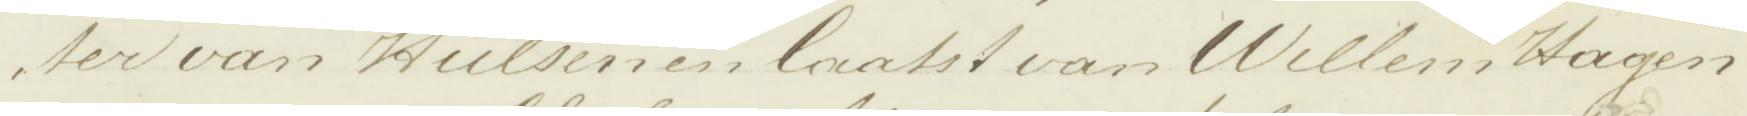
,ter van Hulsen en laatst van Willem Hagen
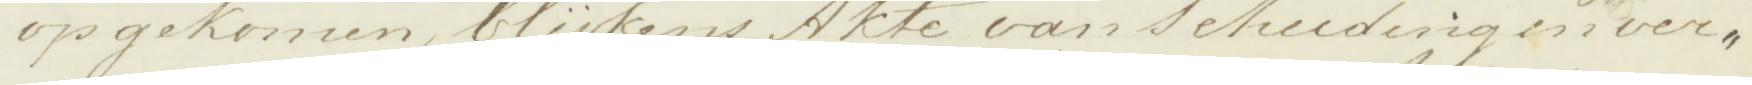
op gekomen, blijkens Akte van Scheiding en ver„
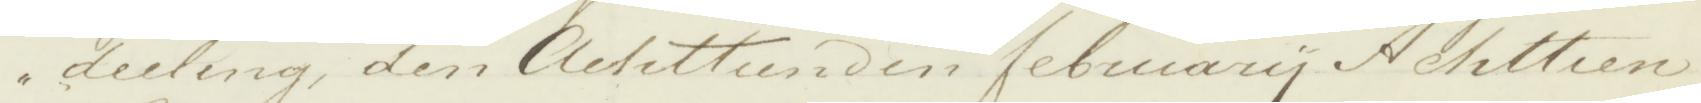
„deeling, den Achttienden februarij Achttien
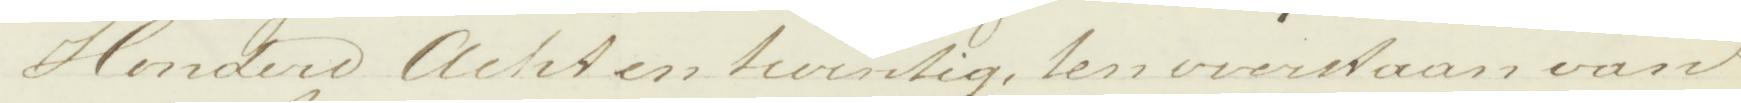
Honderd Acht en twintig, ten overstaan van
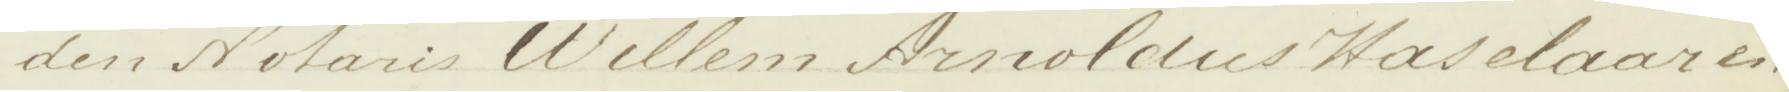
den Notaris Willem Arnoldus Haselaar en
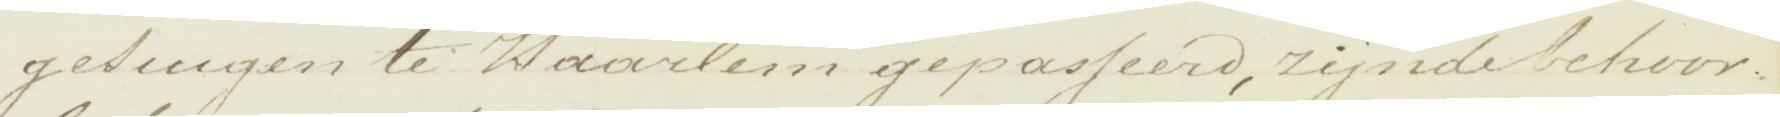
getuigen te Haarlem gepasseerd, zijnde behoor„
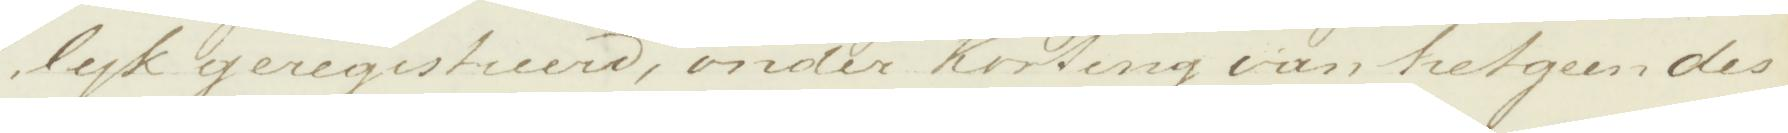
,lyk geregistreerd, onder korting van hetgeen des
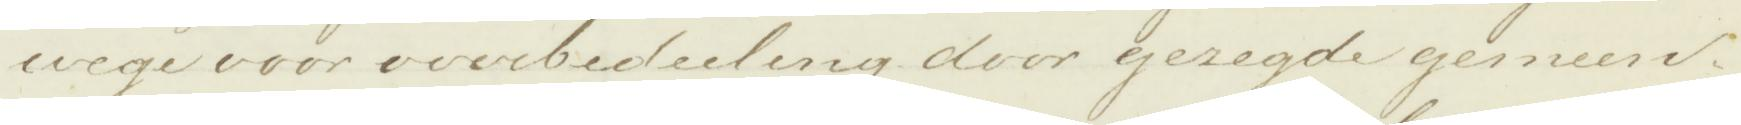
wege voor voorbedeeling door gezegde gemeen„
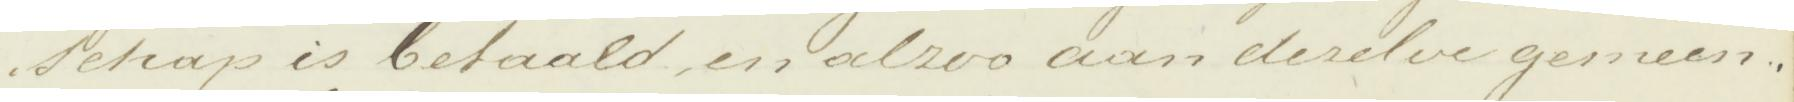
,schap is betaald, en alzoo aan dezelve gemeen„
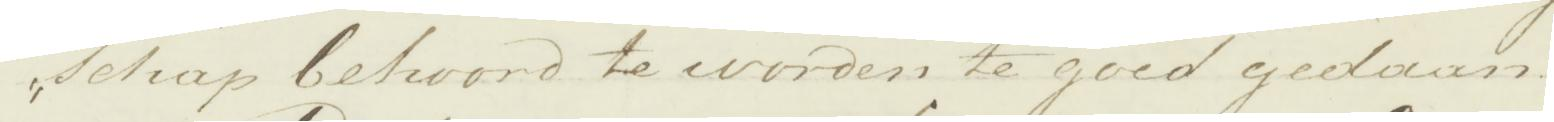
„schap behoord te worden te goed gedaan.
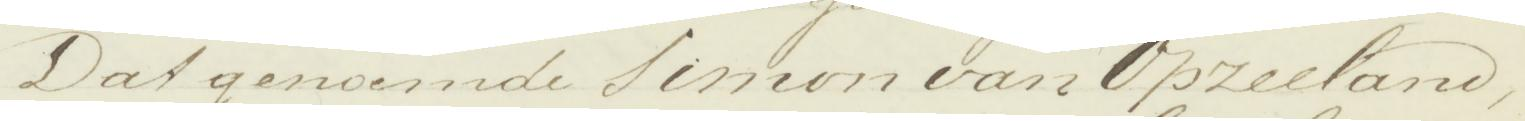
Dat genoemde Simon van Opzeeland,
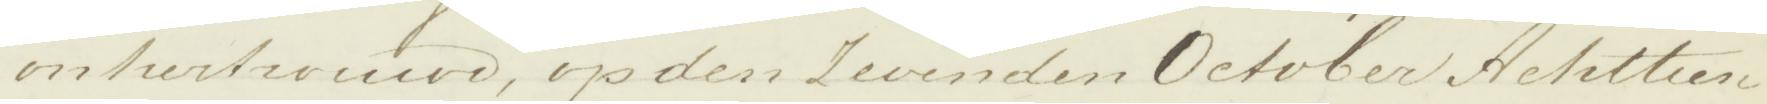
onhertrouwd, op den Zevenden October Achttien
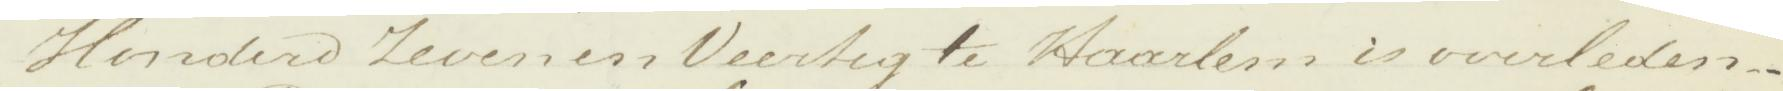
Honderd Zeven en Veertig te Haarlem is overleden-
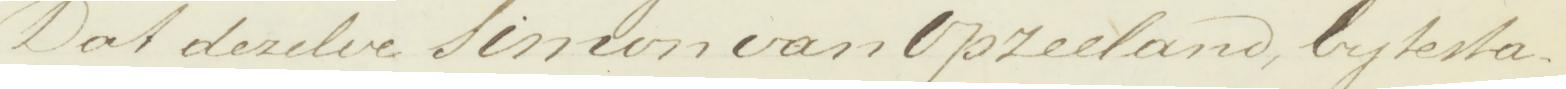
Dat dezelve Simon van Opzeeland, by testa„
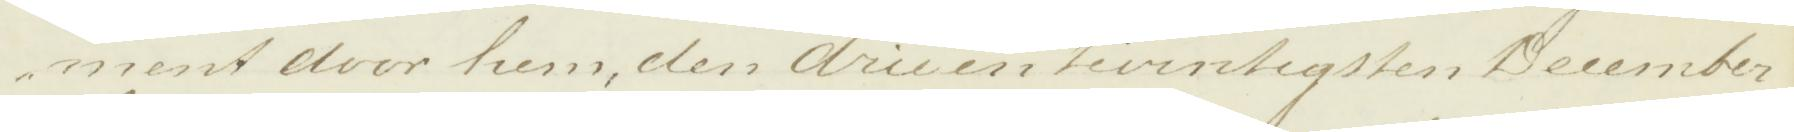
„ment door hem, den drie en twintigsten December
